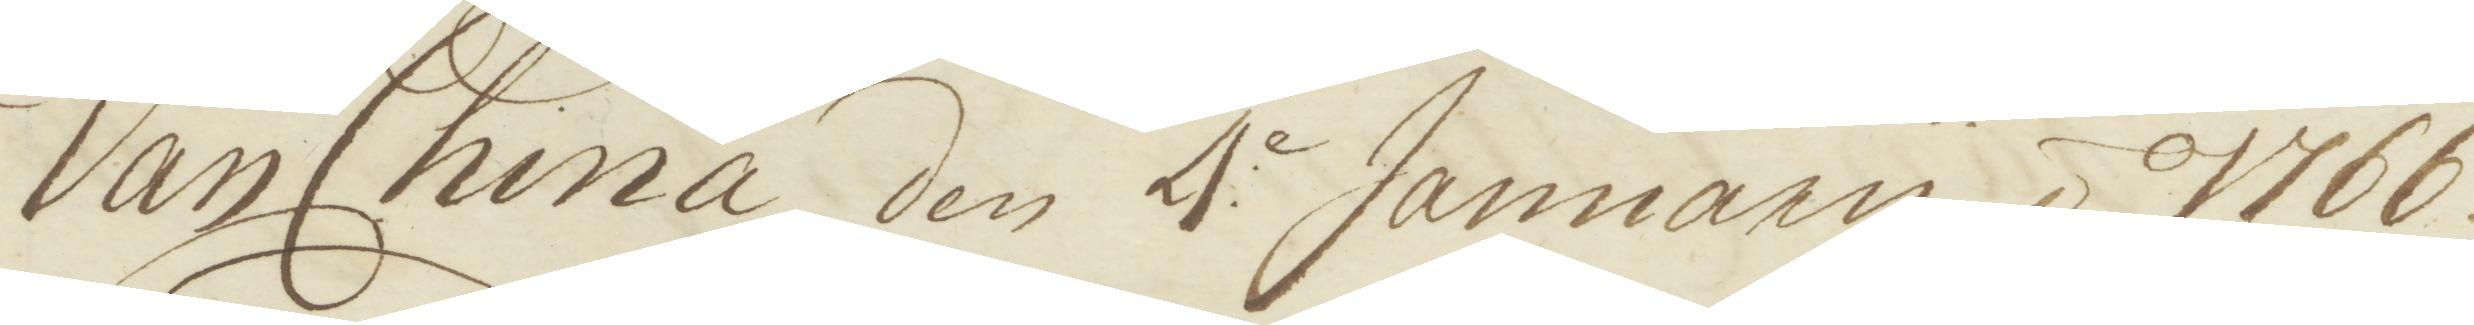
Van China den 4:e Januarij ao 1766:
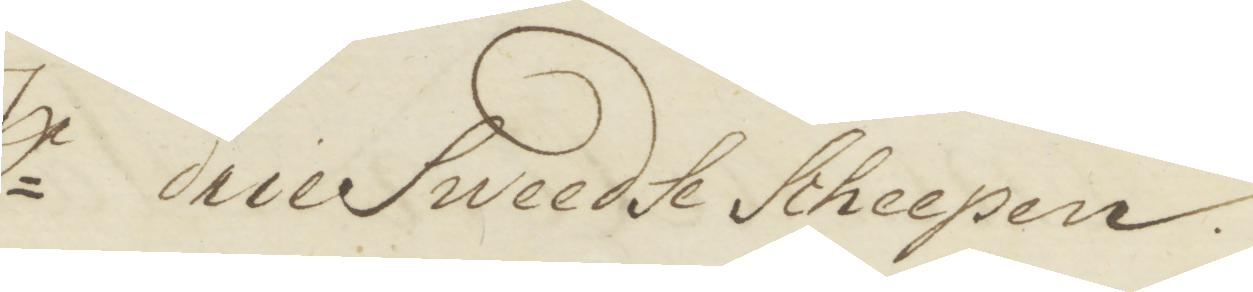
P=r drie sweedse scheepen.
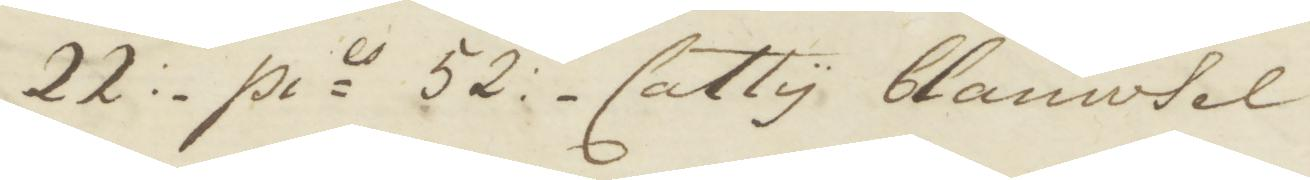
22:- pc=es 52: - Cattij blauwsel
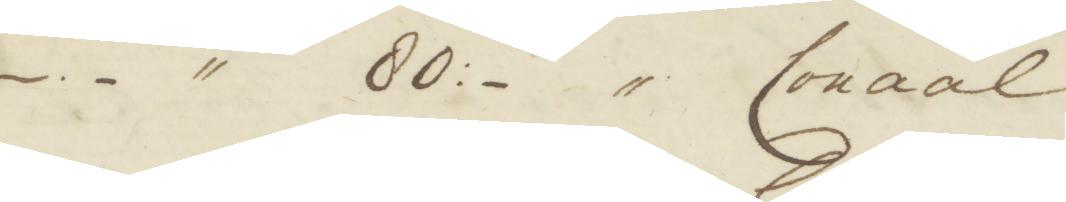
–. - „ 80:— „ Coraal
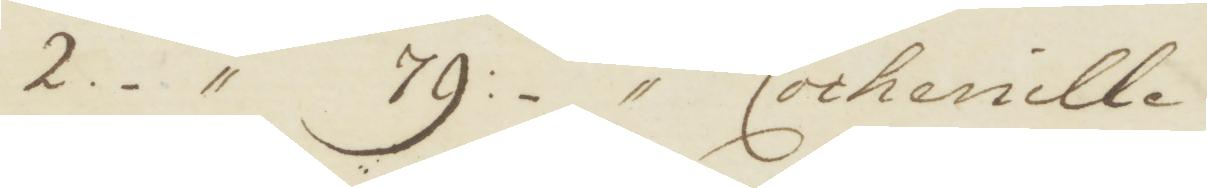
2.- „ 79:- „ Cochenille
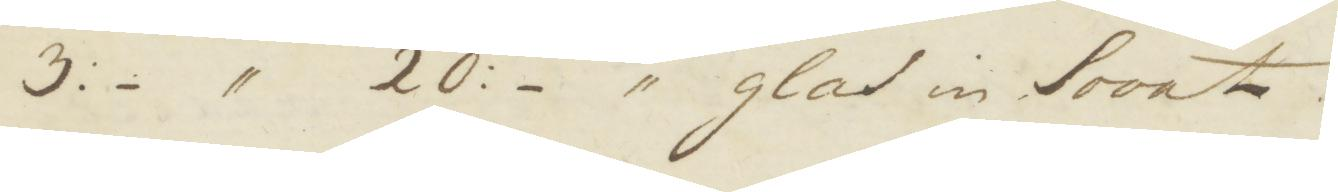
3: - „ 20: — „ glas in soort.
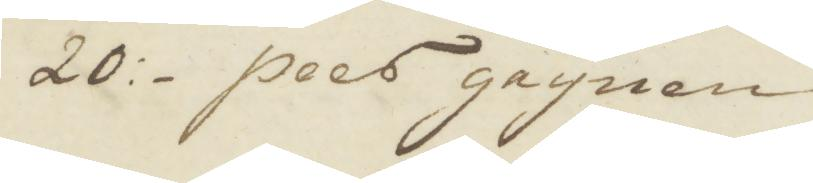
20:– pees grijnen
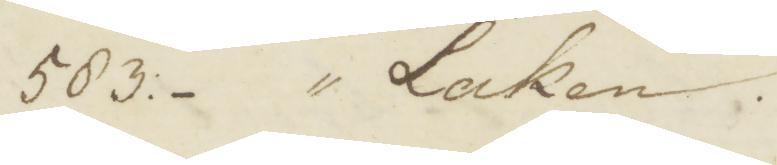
583:- „ Laken.
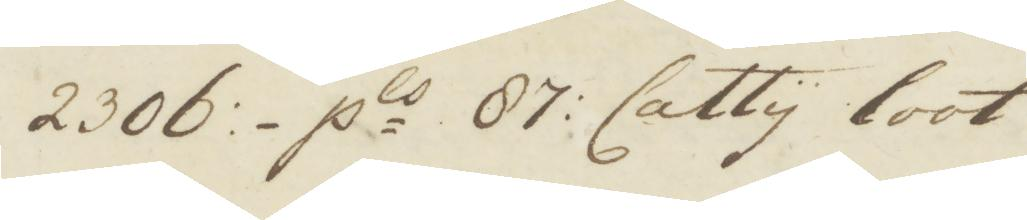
2306:- p=ls 87: Cattij loot
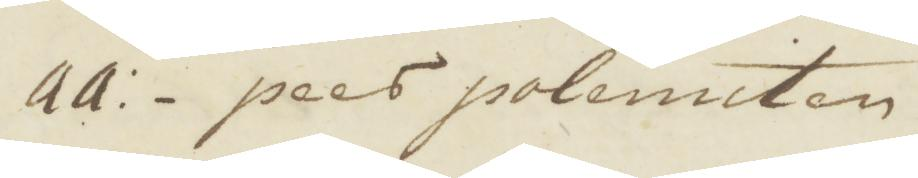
44: - pees polemiten
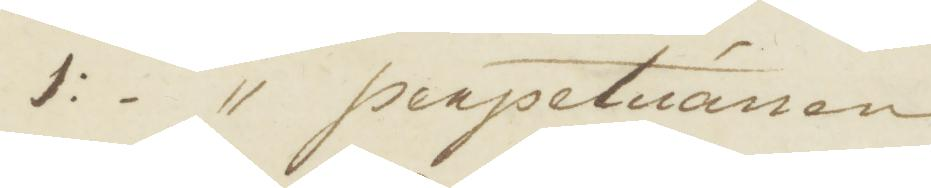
1: - „ perpetuanen
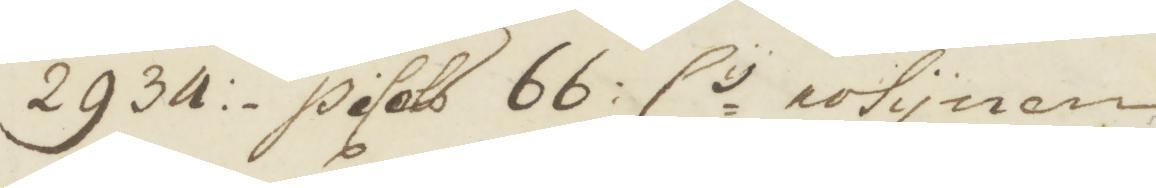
2934:- picols 66: C=ij rosijnen
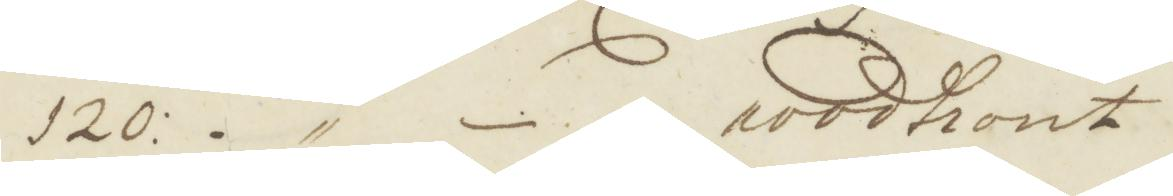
120: - „ — . „ roodhout
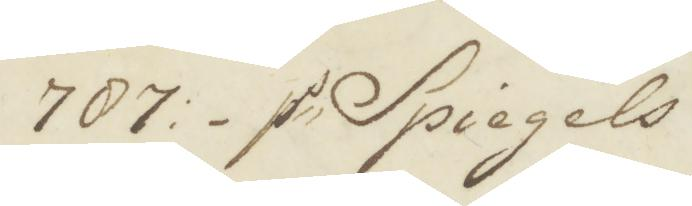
787: – p„s spiegels
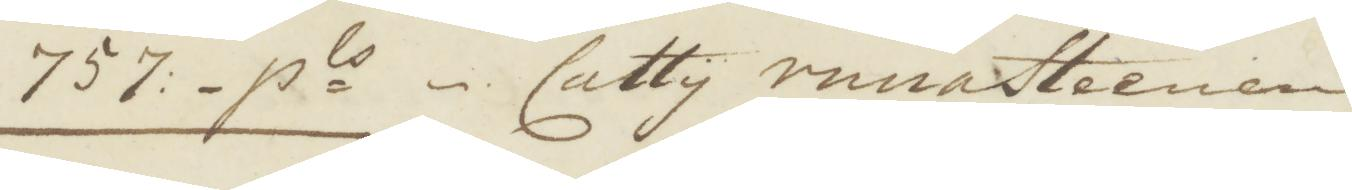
757: – p=ls —. Cattij vuursteenen
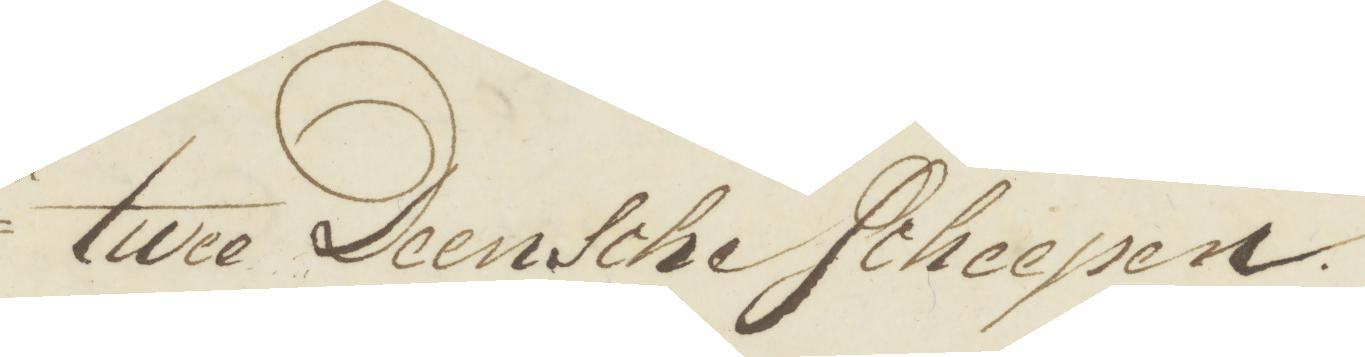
P=r twee Deensche scheepen.
